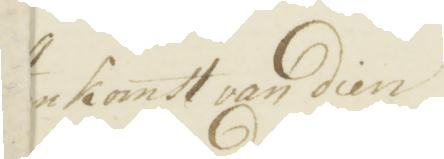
nkomst van dien
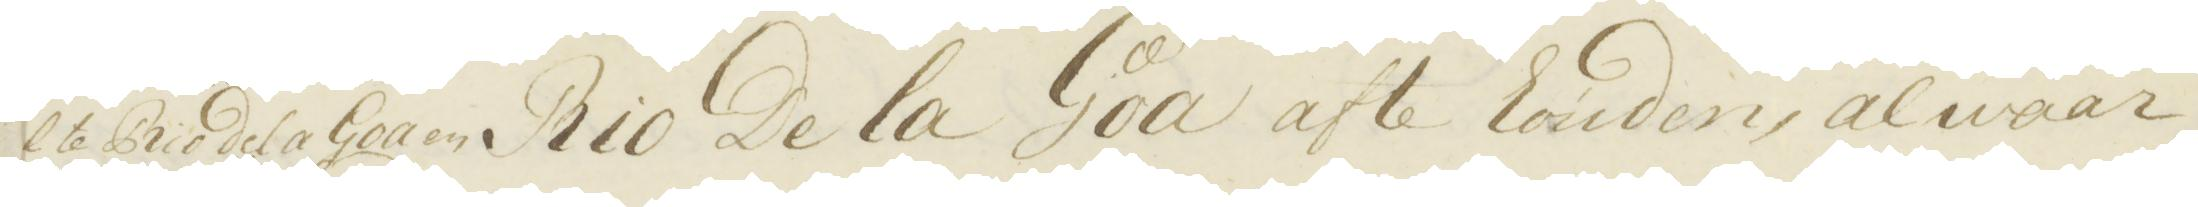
te Rio de la Goa en Rio De la Goa afte houden, alwaar
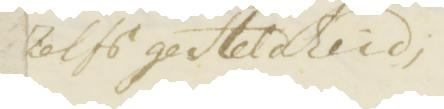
zelfs gesteldheid,
